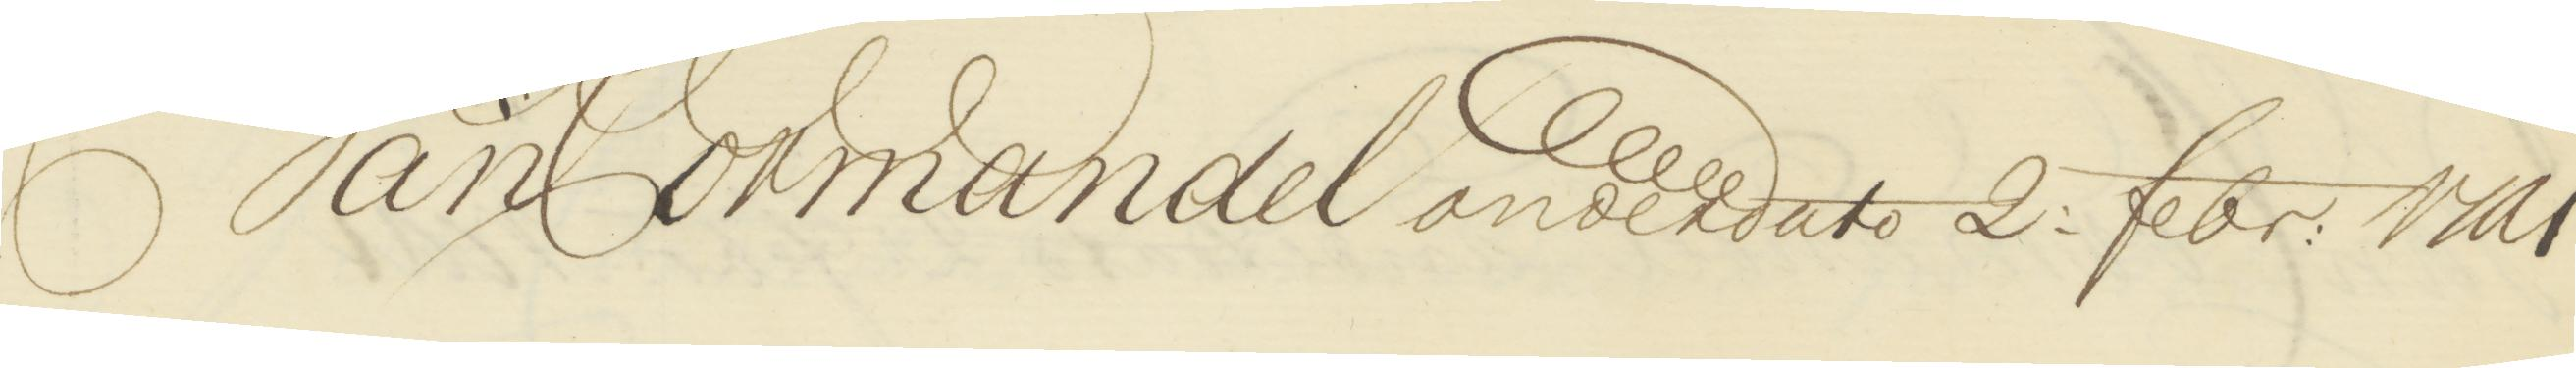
Van Cormandel onder dato 2: febr: 1741
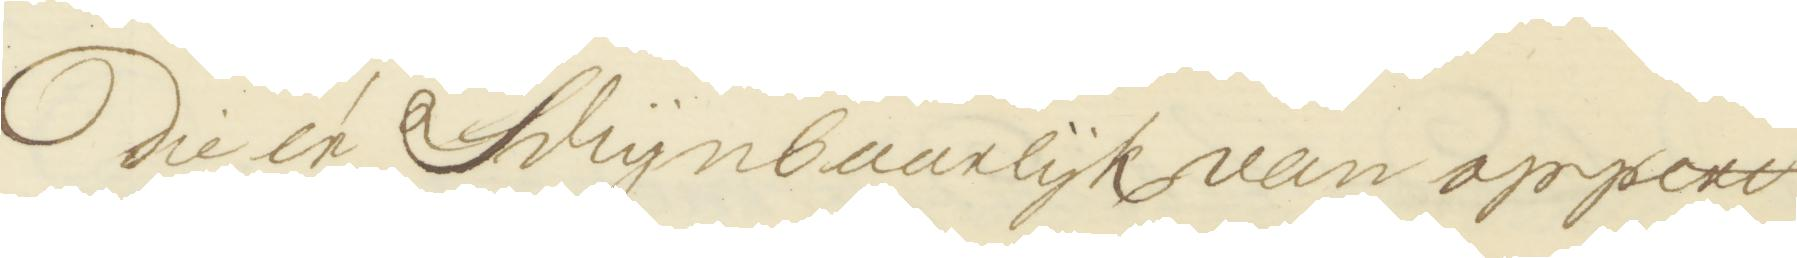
die er' schijnbaarlijk van oppert
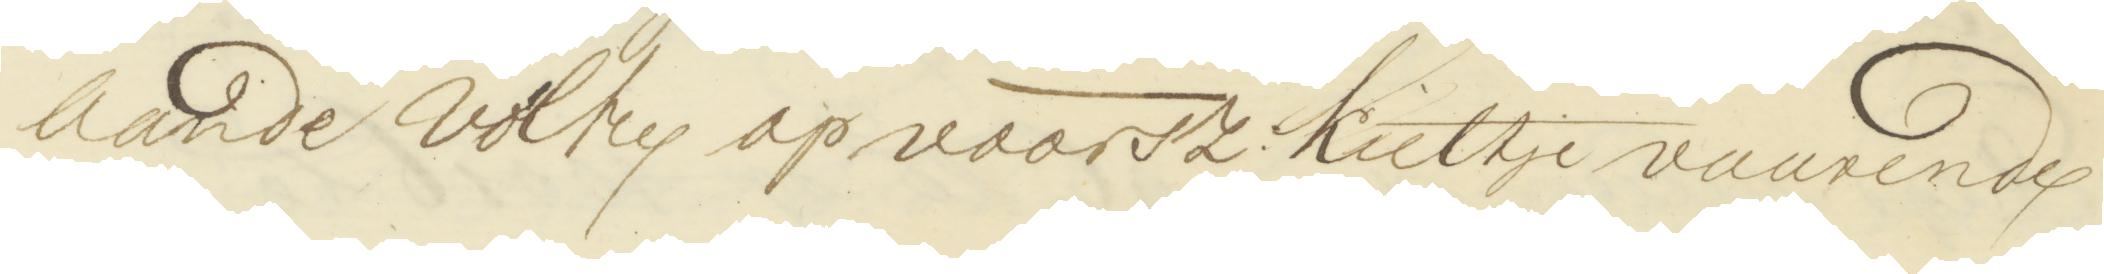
Aande volke op voorsz: kieltje vaarende
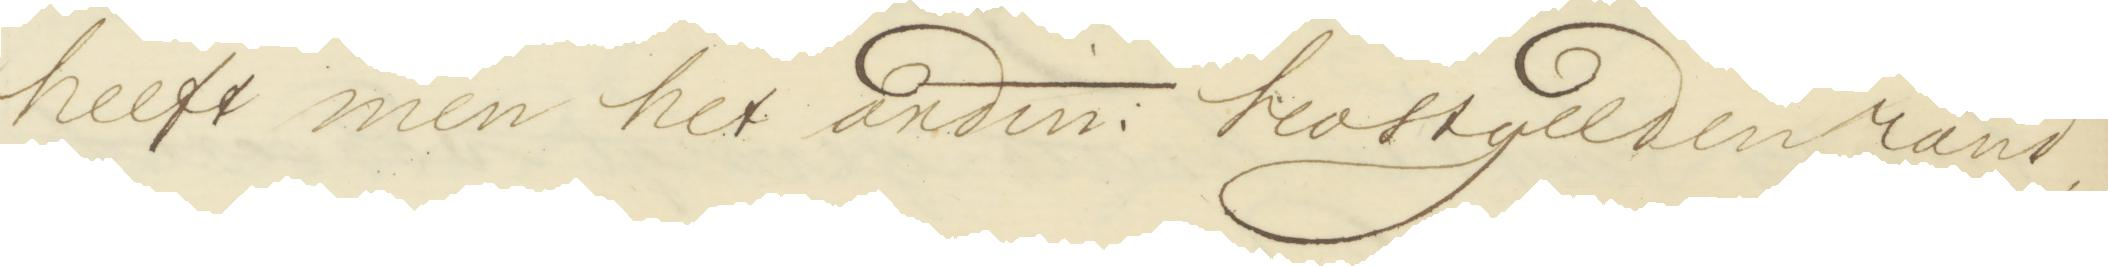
heeft men het ordin: kostgeldenrand„
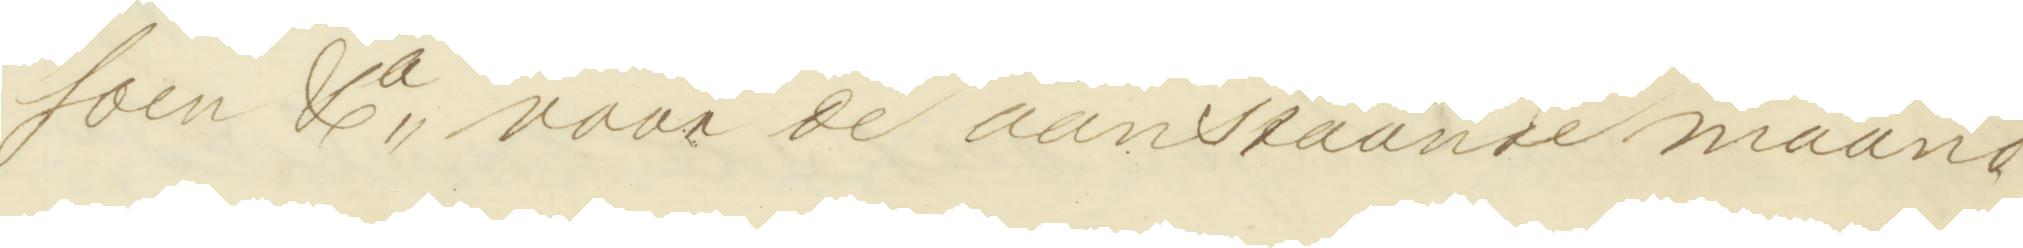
soen &„a voor de aanstaande maand
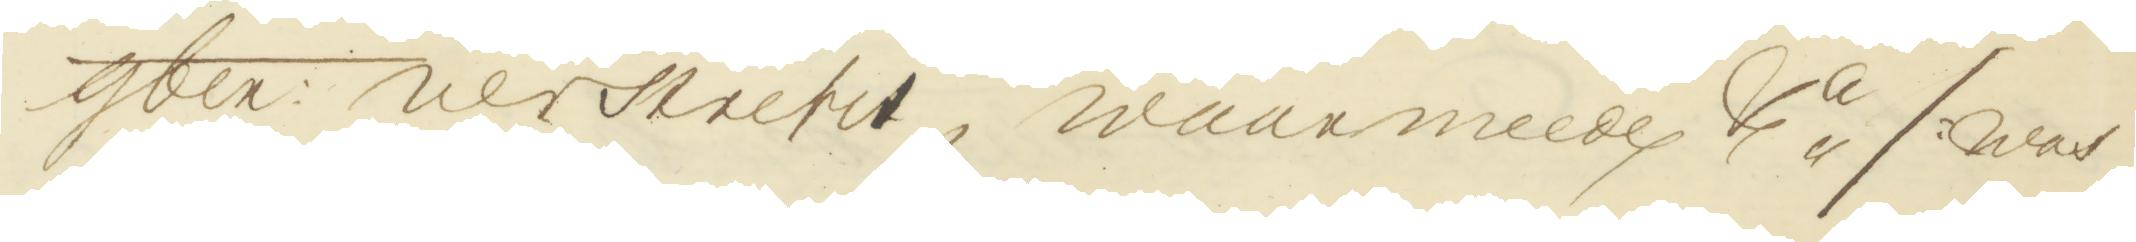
9ber: verstrekt, waarmeede &„a /:was
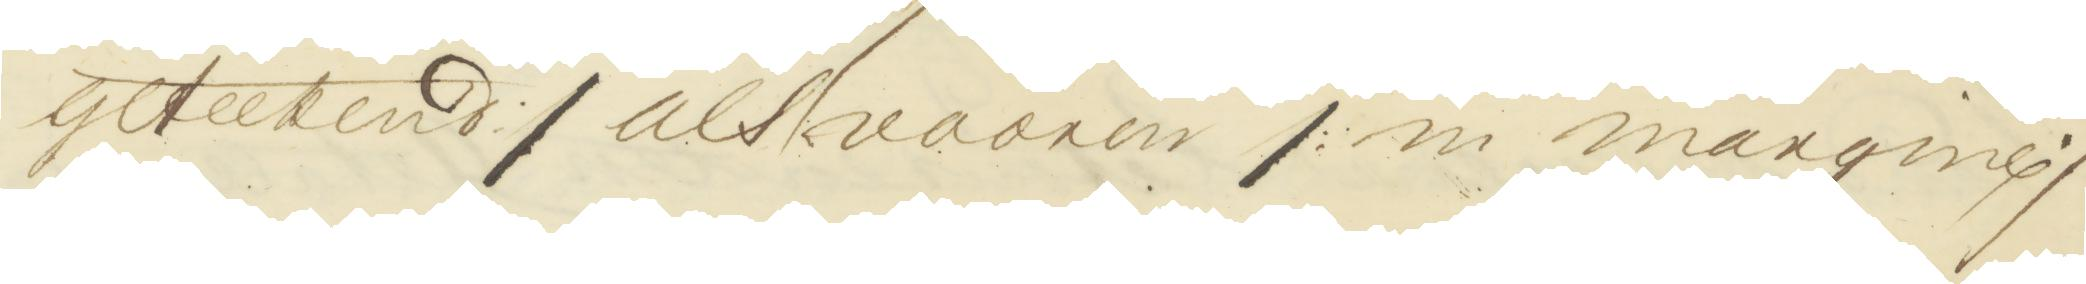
geteekend:/ als|vooren /:in margine:/
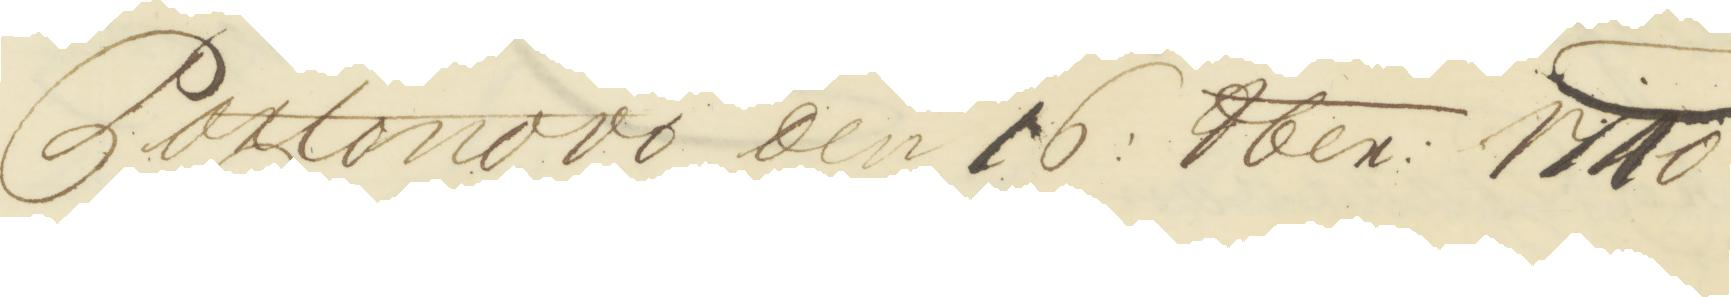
Portonovo den 16: 8ber: 1740
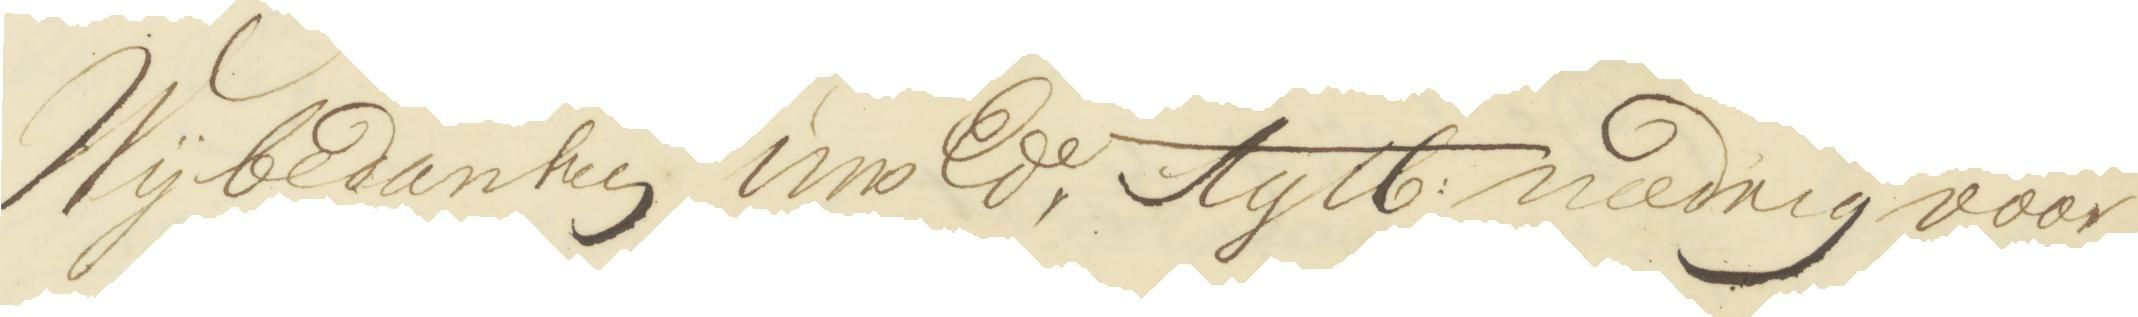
Wij bedanken uw Ed„e Agtb: needrig voor
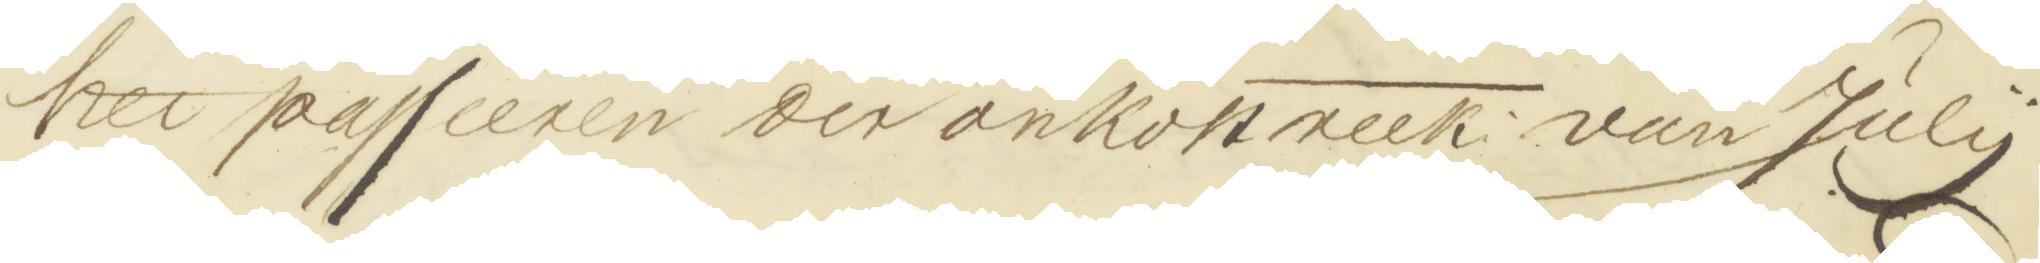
het passeeren der onkostreek: van Julij
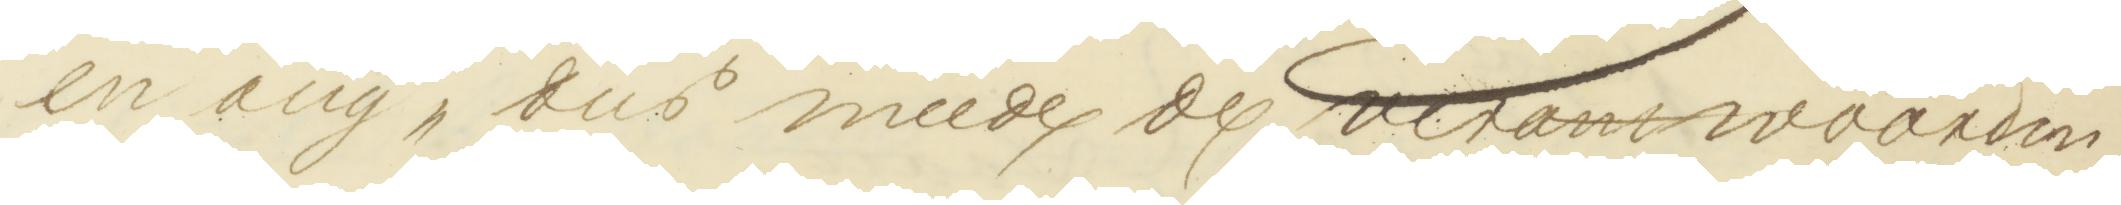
en aug„s dus meede de verantwoordin
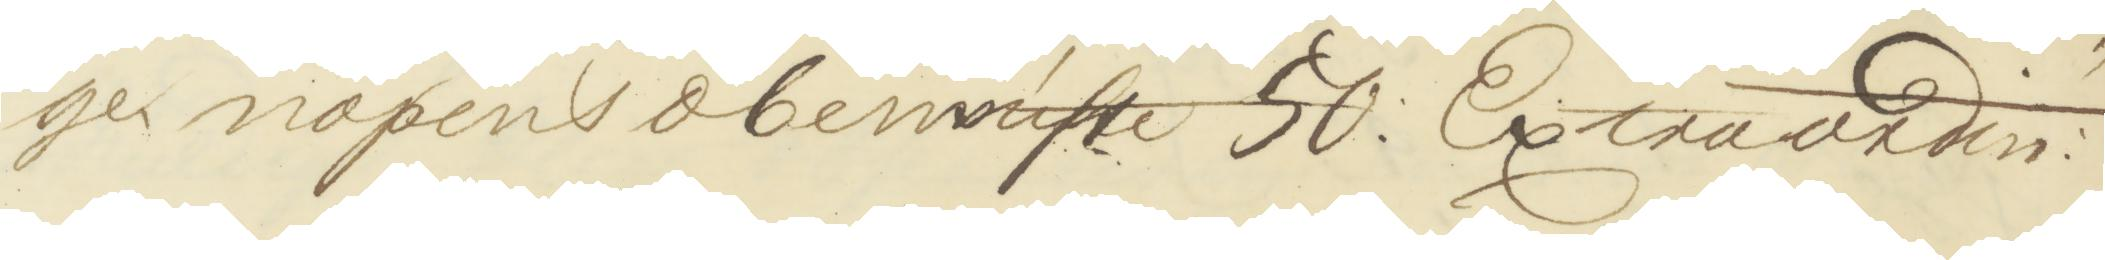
ge nopens d' bewuste 50: Extraordin:
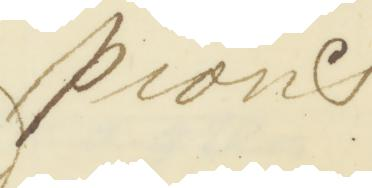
pions
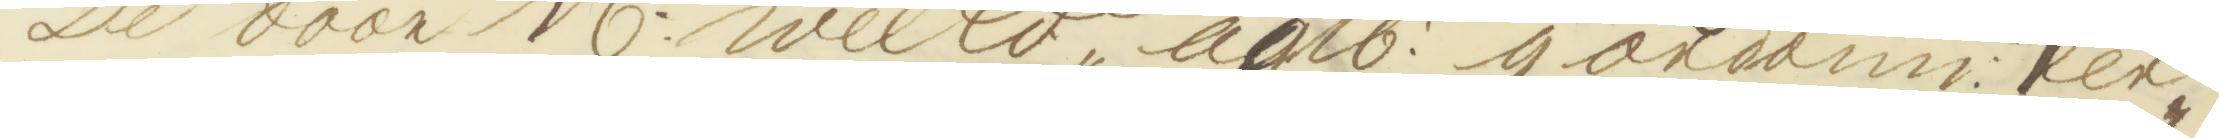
De door VE: wel Ed„e agtb: g ordonn: Ver„
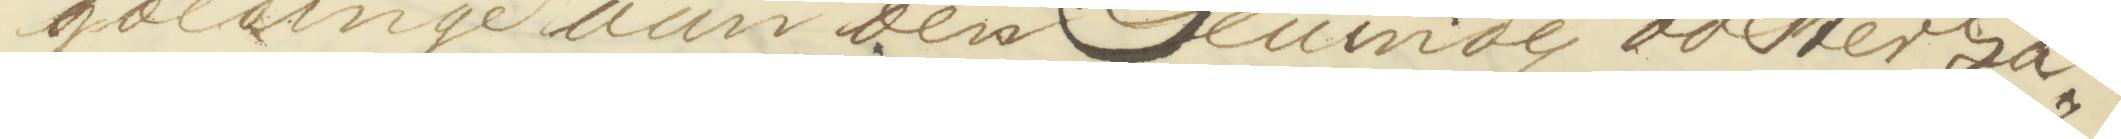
goedinge aan den Secunde oosterha„
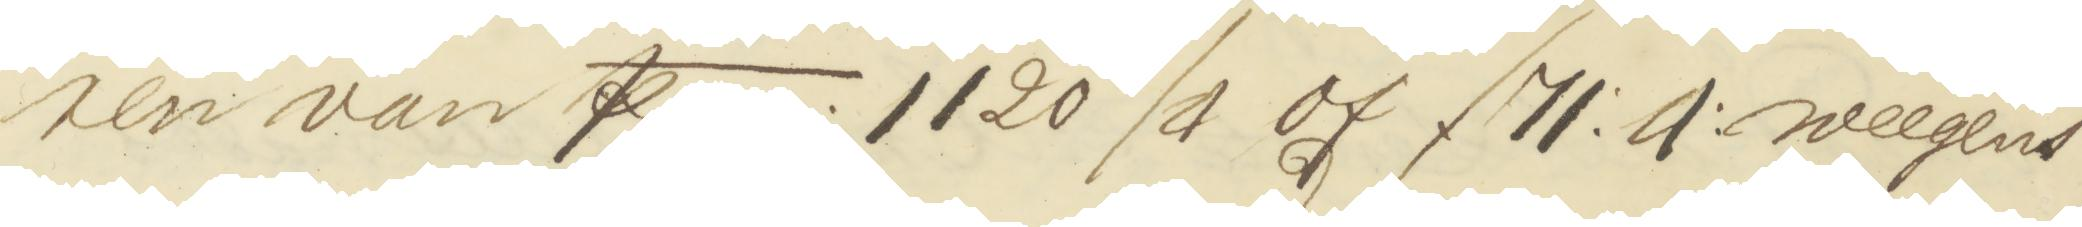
ven van pag. 1120 4/4 of ƒ 71: 4: weegens
